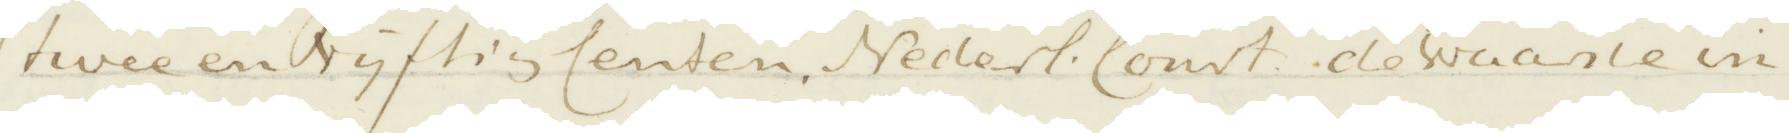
twee en vijftig Centen, Nederl. Court de waarde in
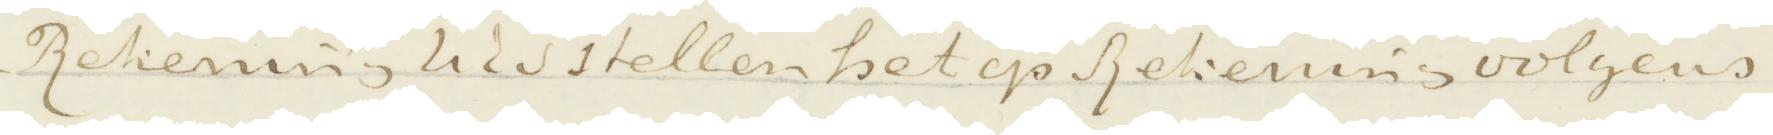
Rekening U Ed stellen het op Rekening volgens
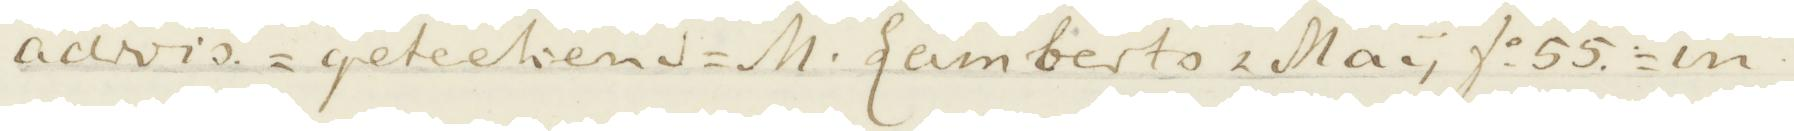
advis. = geteekend = M: Lamberts 2 Maij f:o 55. = in
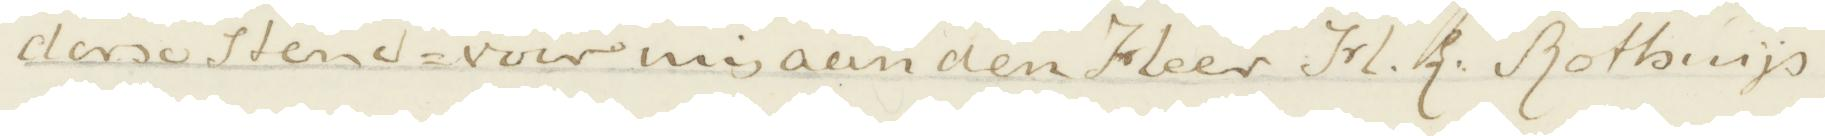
dorso stond = voor mij aan den Heer H.L. Rothuijs
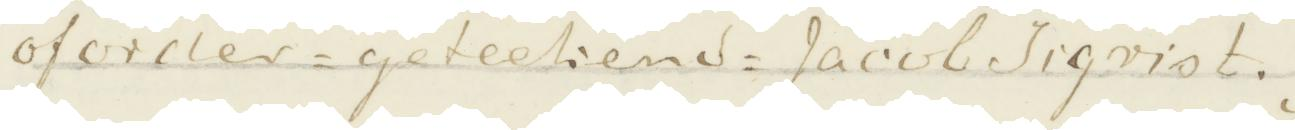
of order = geteekend = Jacob Sigrist.
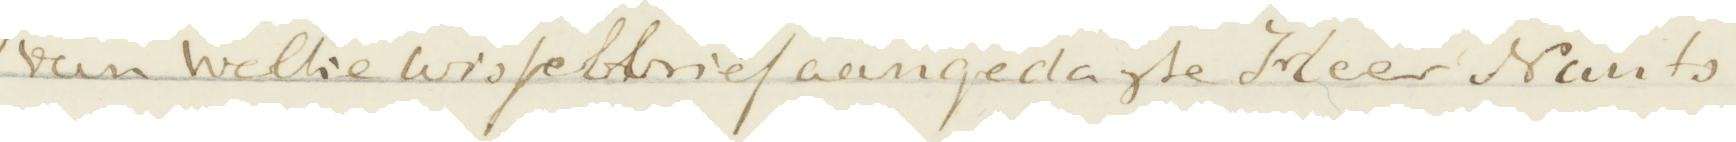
ven welke wisselbrief aan gedagte Heer Nauts
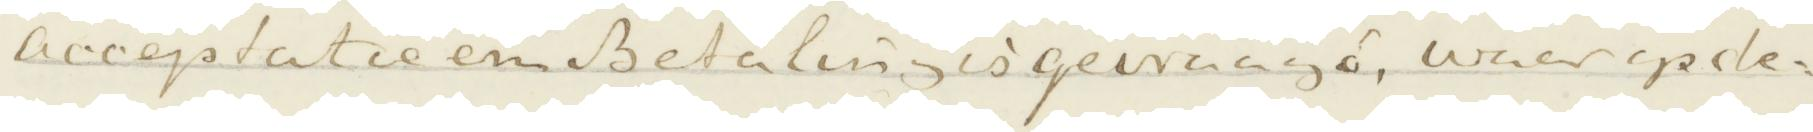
Acceptatie en Betaling is gevraagd, waar op de=
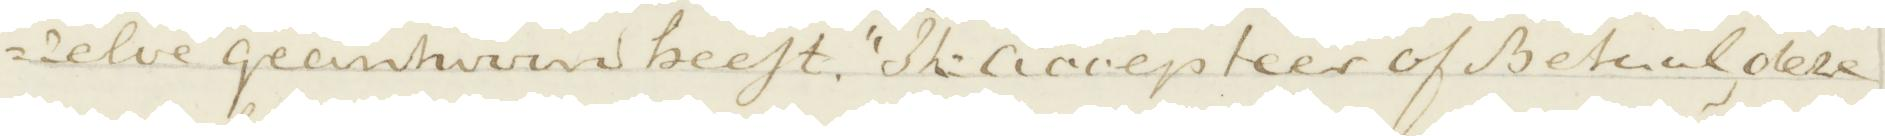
=zelve geantwoord heeft, "Ik accepteer of Betaal deze
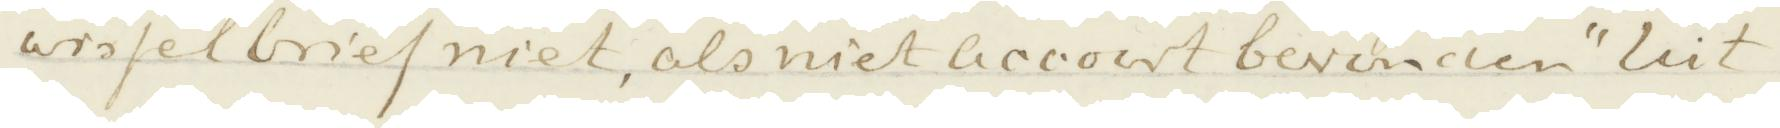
wisselbrief niet, als niet accoort bevonden" Uit
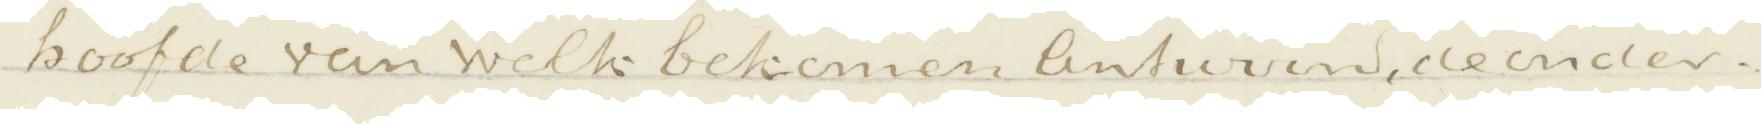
hoofde van welk bekomen Antwoord, de onder-
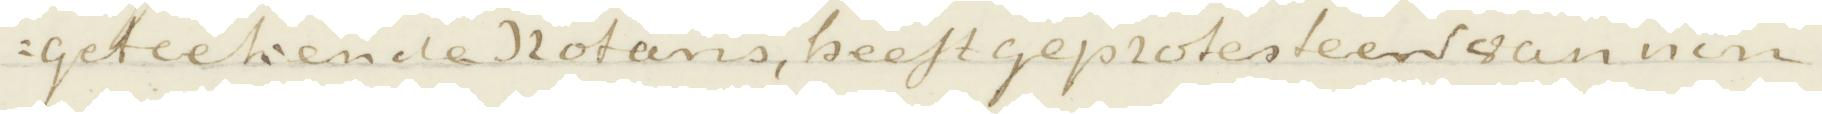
=geteekende Notaris, heeft geprotesteerd van non
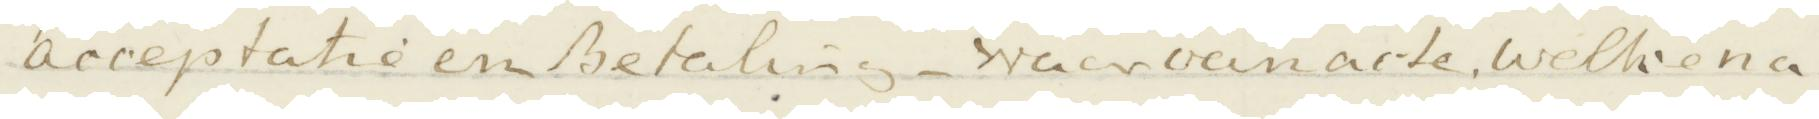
acceptatie en Betaling - Waar van acte, welke na
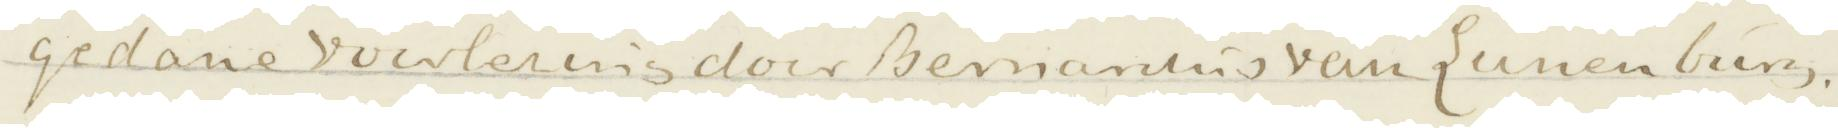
gedane Voorlezing door Bernardus van Lunenburg,
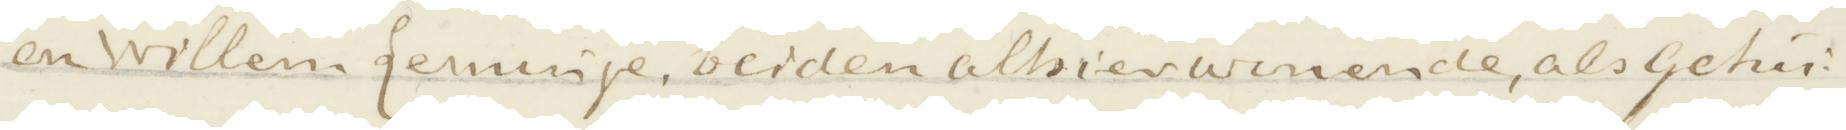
en Willem Leminje, beiden alhier wonende, als Getui:
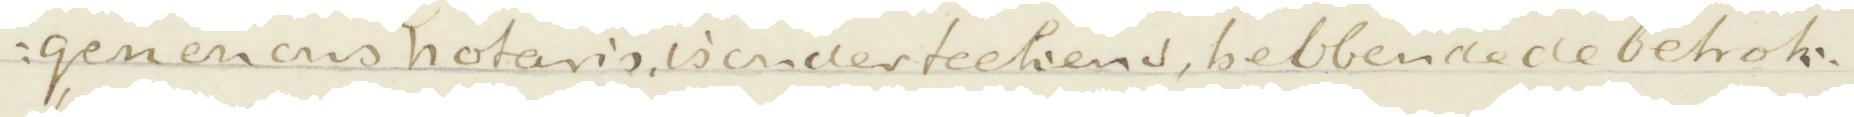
„gen en ons notaris is onderteekend, hebbende de betrok-
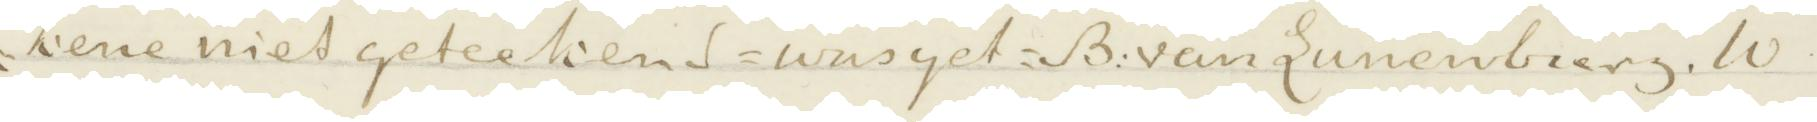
=kene niet geteekend = was get = B. van Lunenburg. W.
